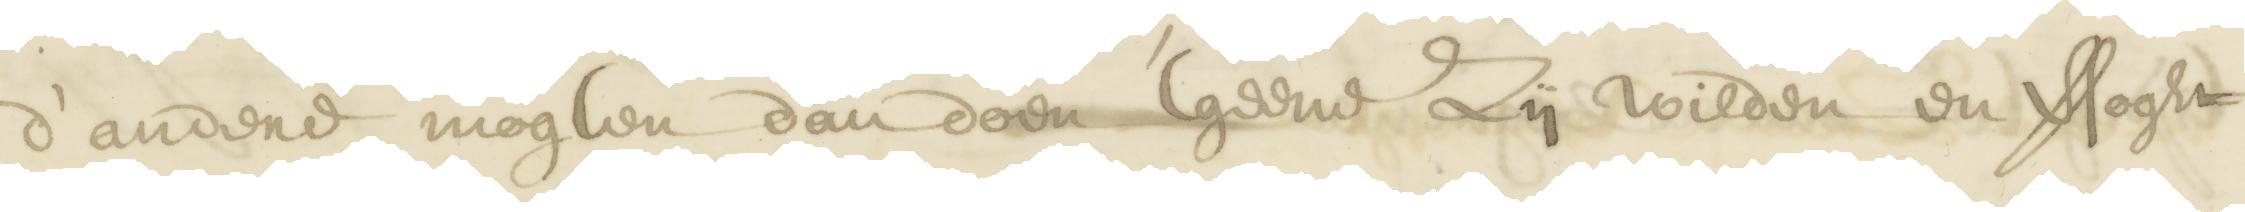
d’andere mogten dan doen 'tgeene zij wilden en versoght
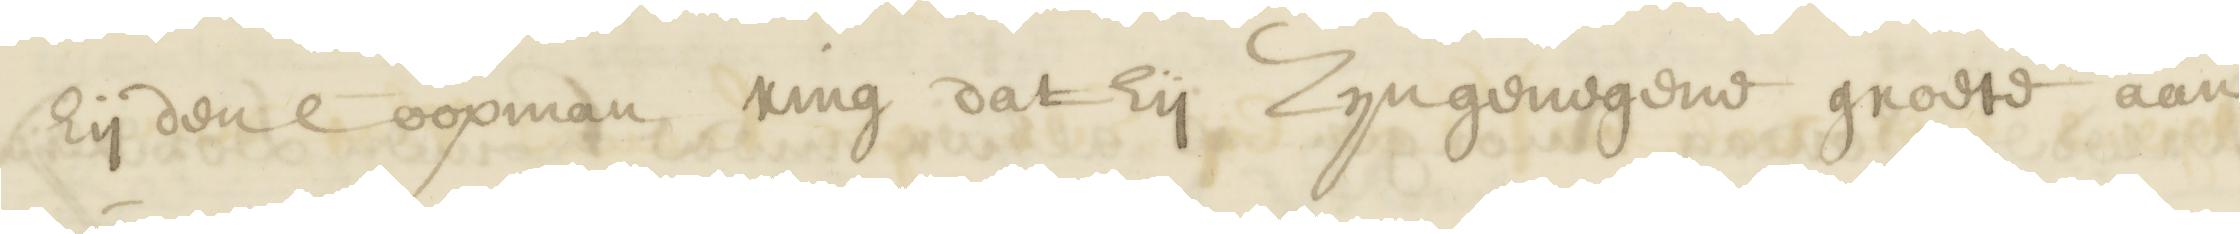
hij den coopman ring dat hij zyn genegene groete aan
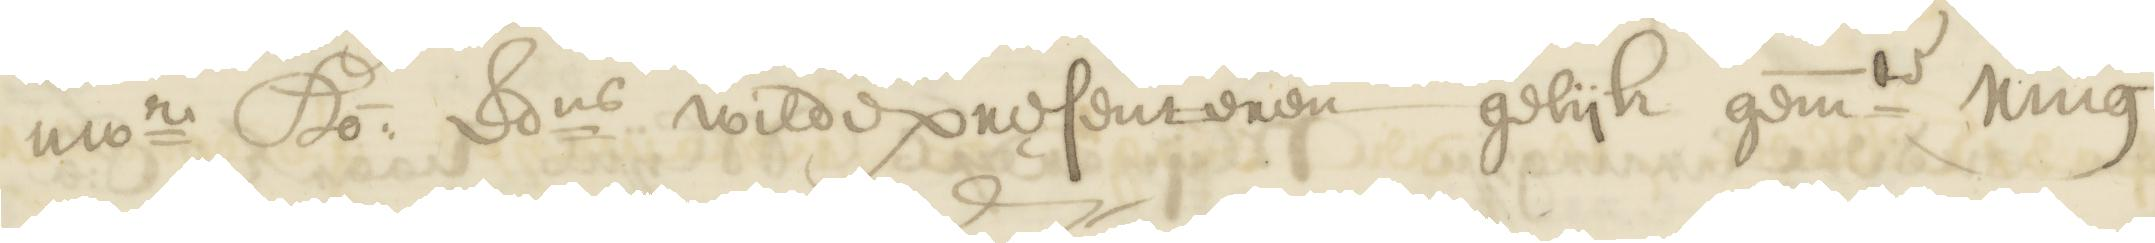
uw=r Ho: Ed=ns wilde presenteren gelijk gem:te ring
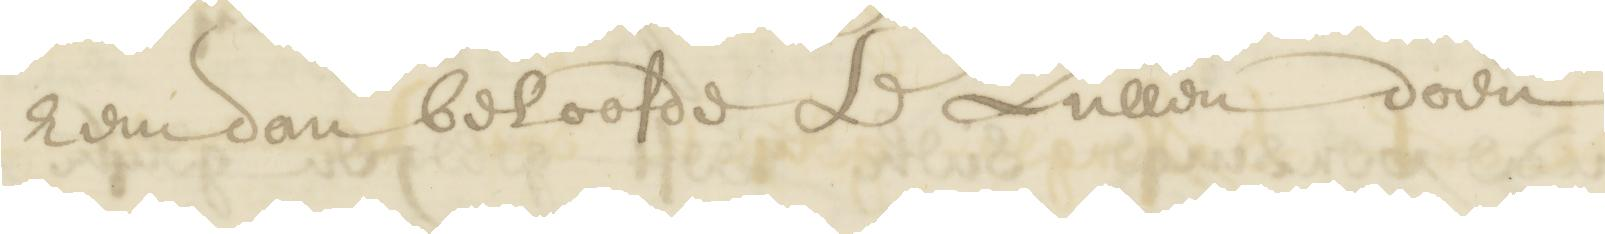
hem dan beloofde te zullen doen
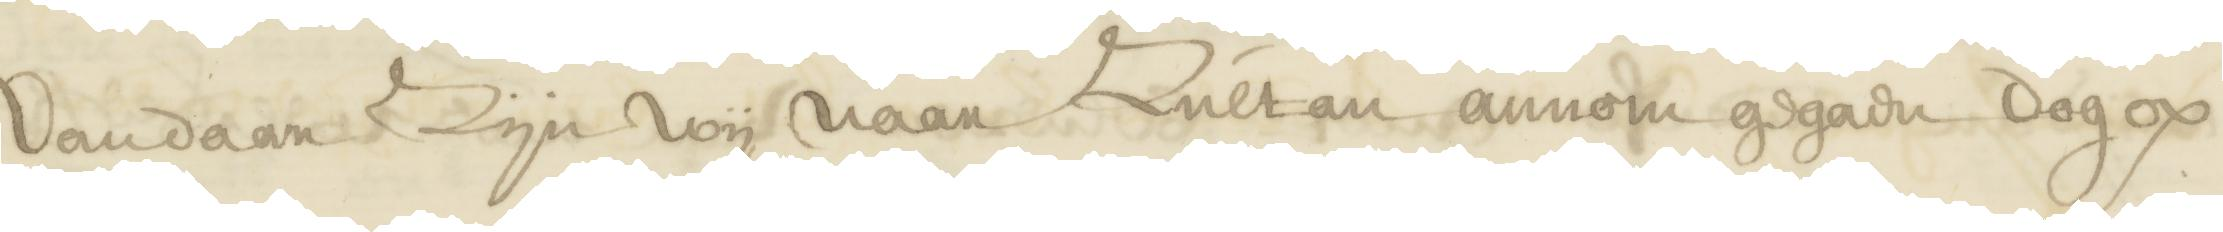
Vandaar zijn wij naar zultan annom gegaen dog op
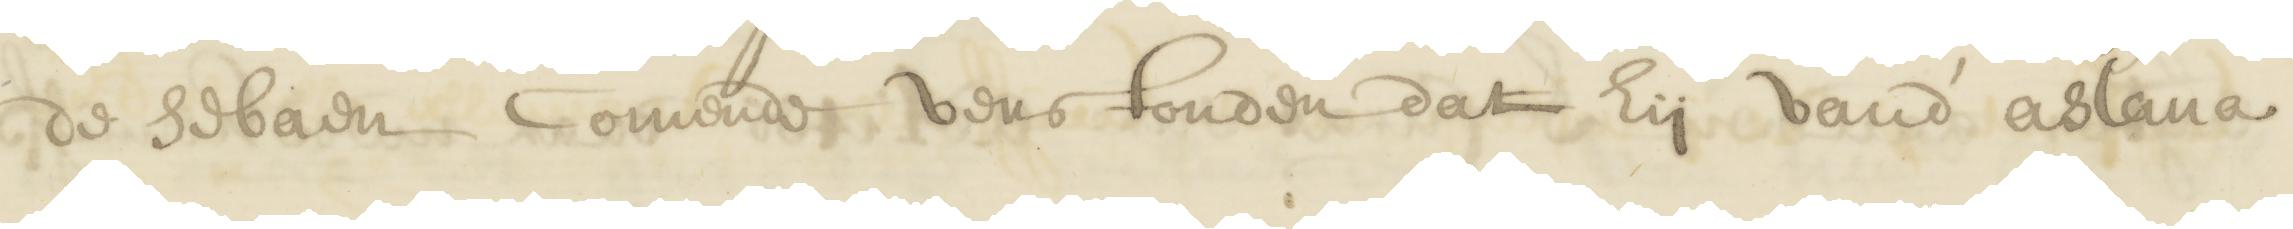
de sebaen comende verstonden dat hij vand' astana
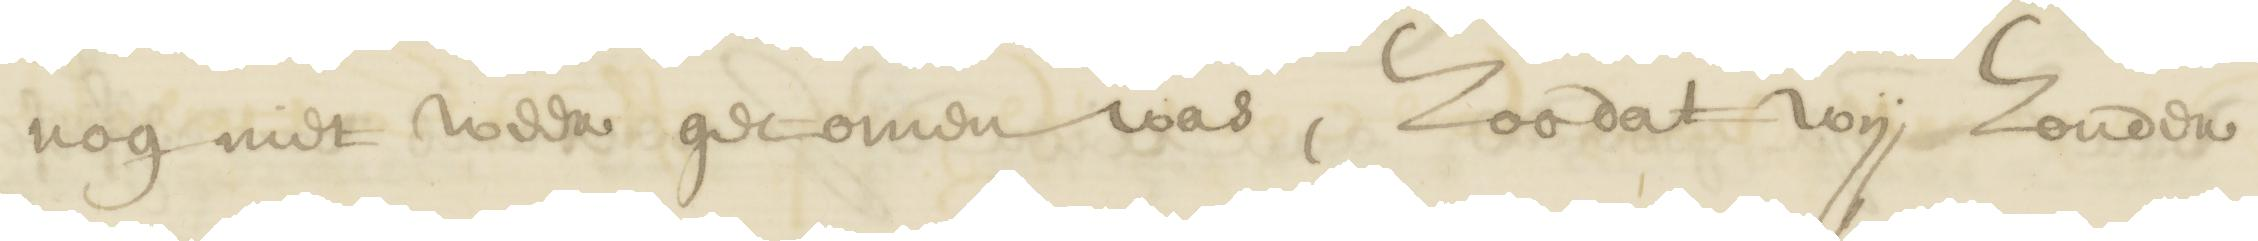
nog niet weer gecomen was, zoodat wij zonder
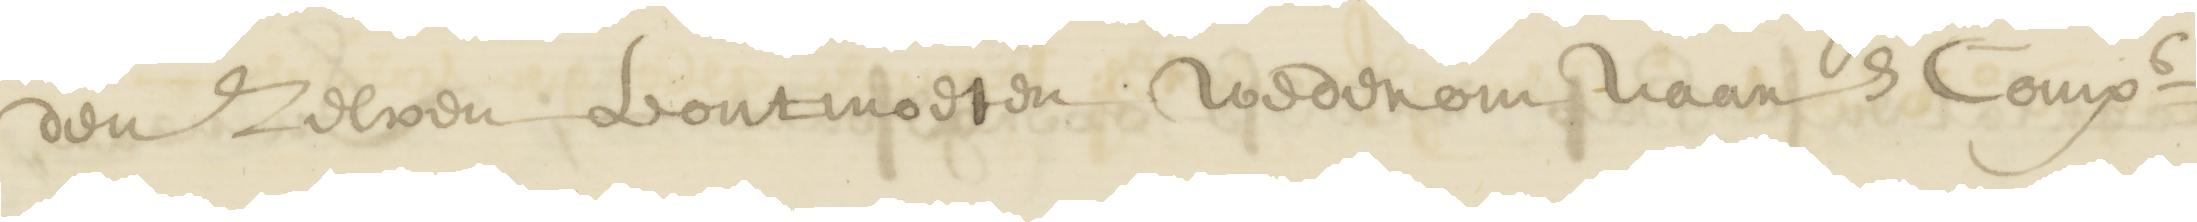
den zelven teontmoeten wederom naar 's Comp=s
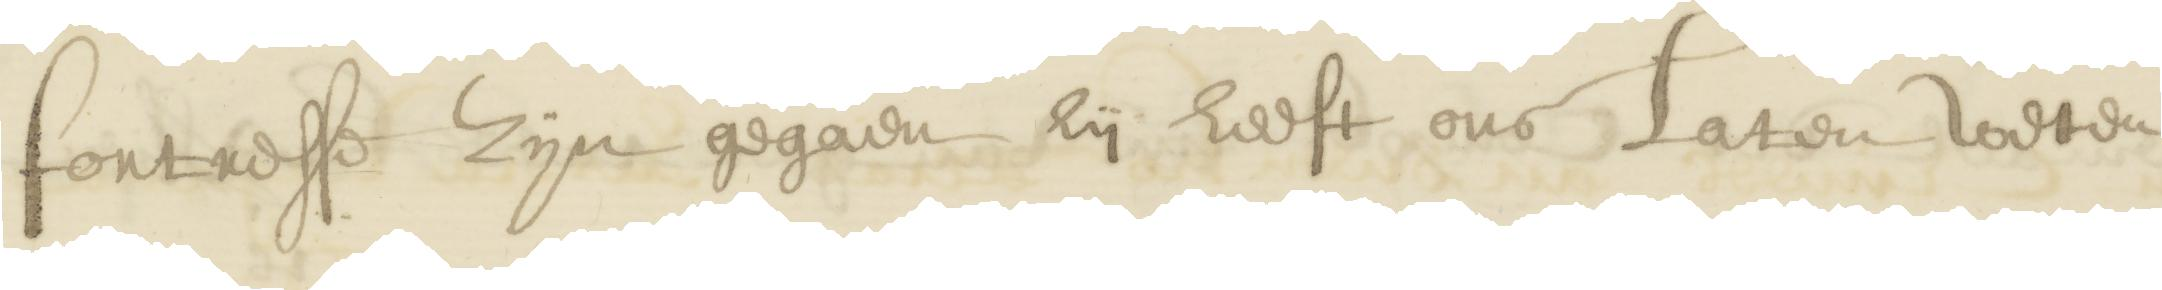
fortresse zijn gegaen hij heeft ons Laten weten
